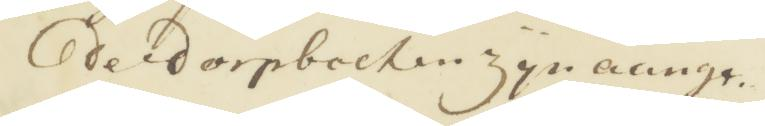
de doopboeken zyn aange.
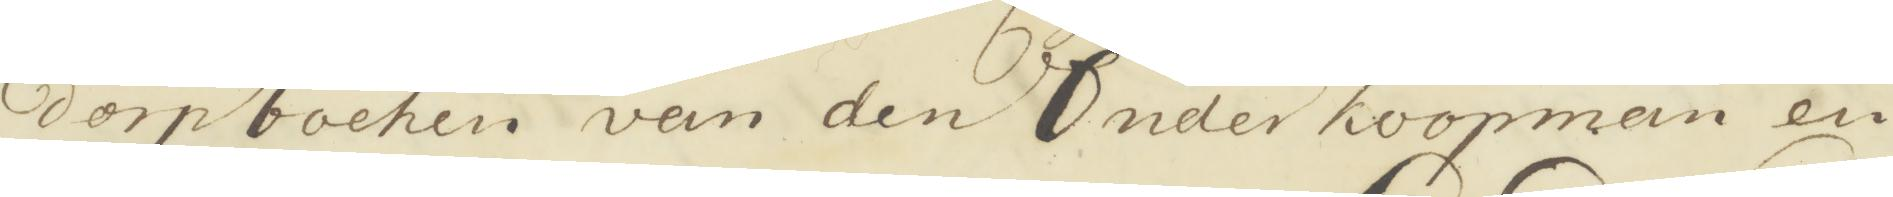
doopboeken van den Onderkoopman en
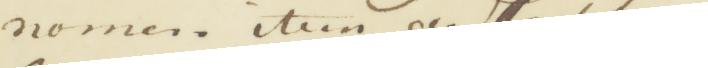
nomen item de de Cassem
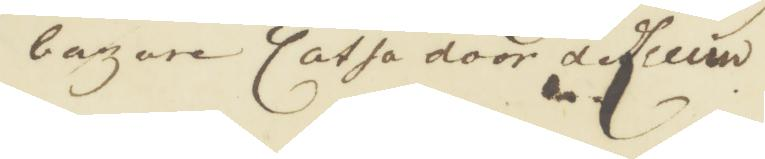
bazare Cassa door de Leeuw
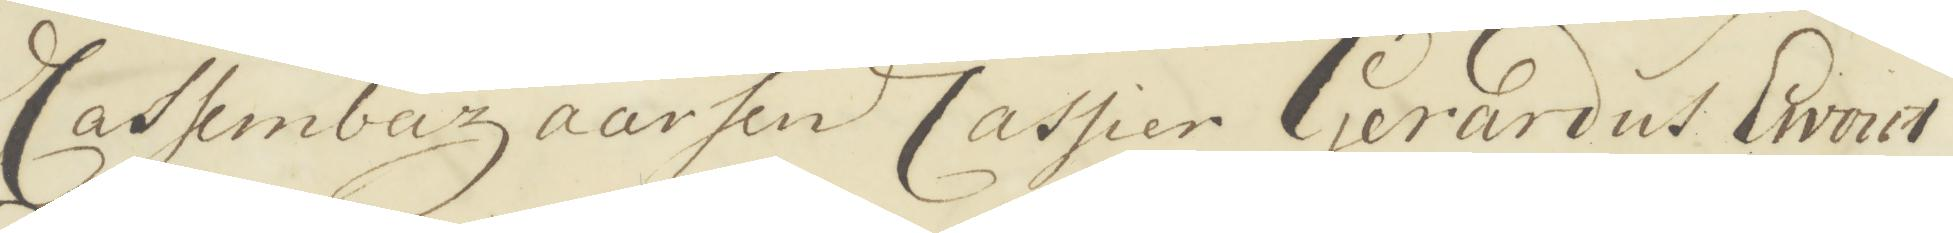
Cassembazaarsen Cassier Gerardus Ewout
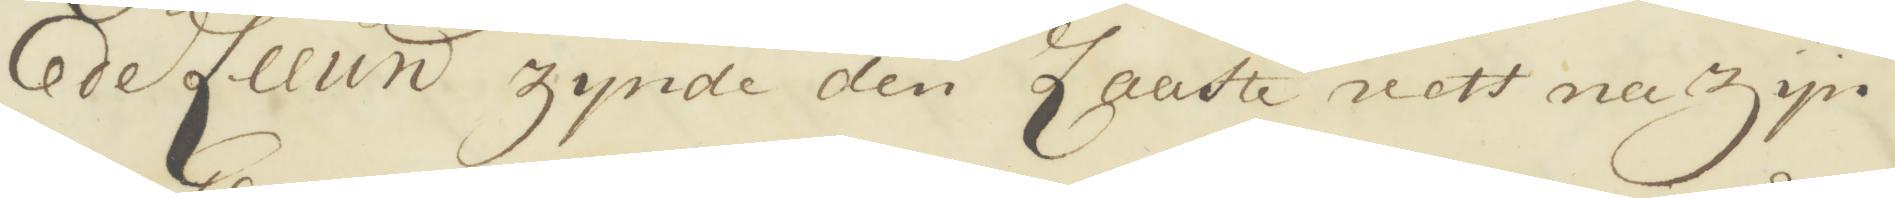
de Leeuw zynde den Laaste vast na zijn
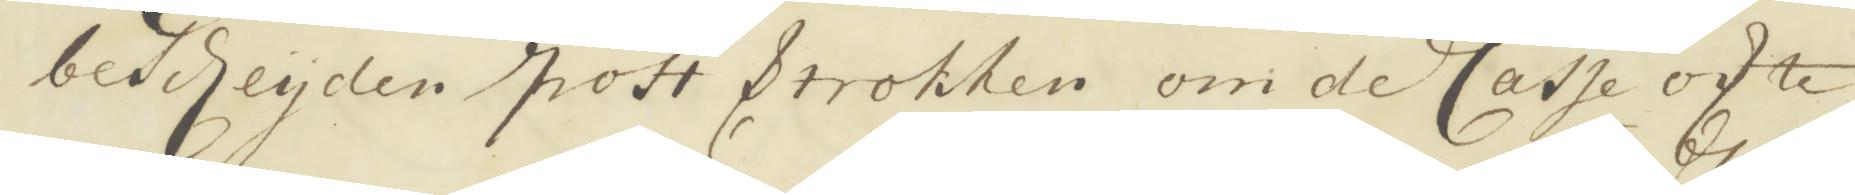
bescheijden post vertrokken om de Casse over te
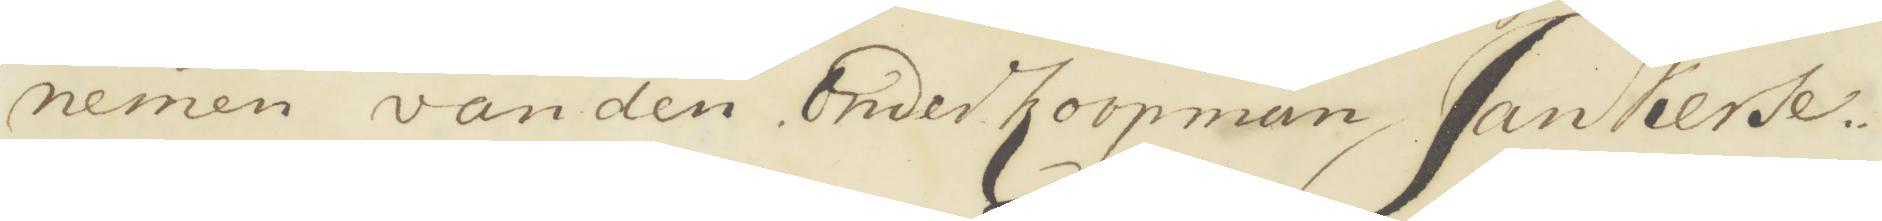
nemen van den Onderkoopman Jan Kerse„
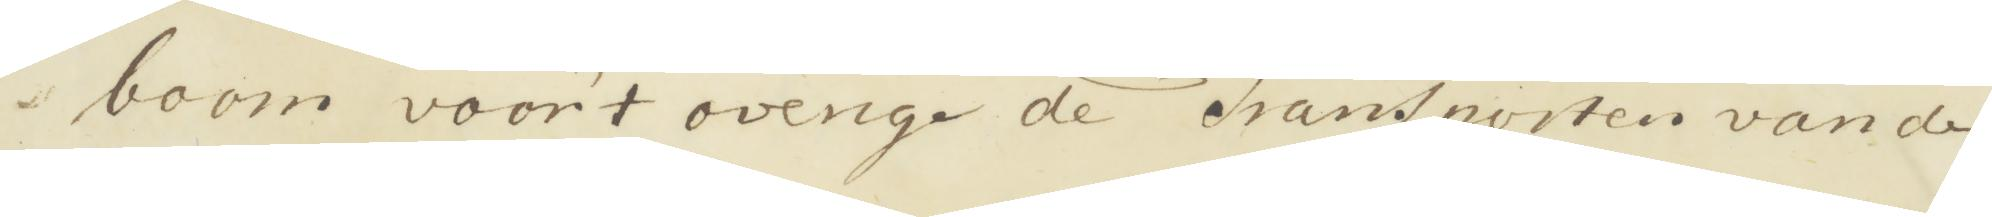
boom voor ’t overige de Transporten van de
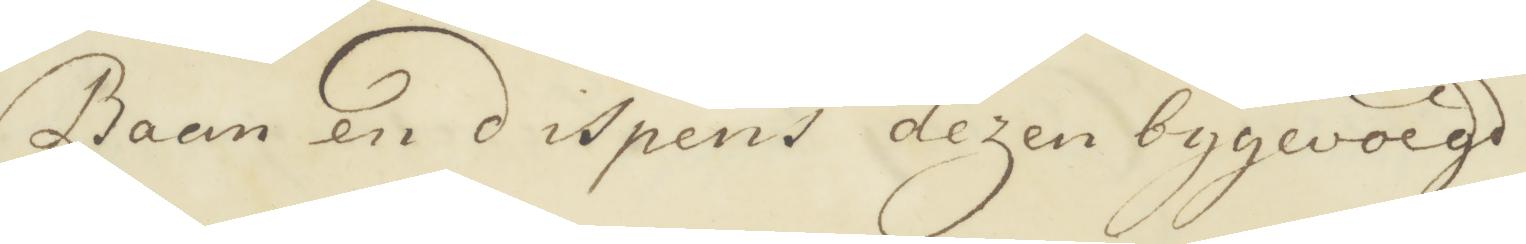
Baan en dispens dezen bygevoegd
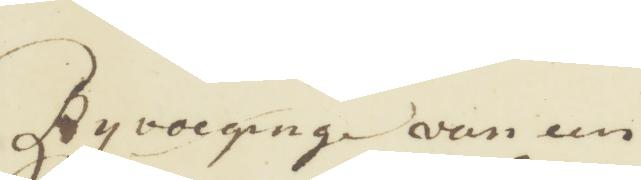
Byvoeginge van een
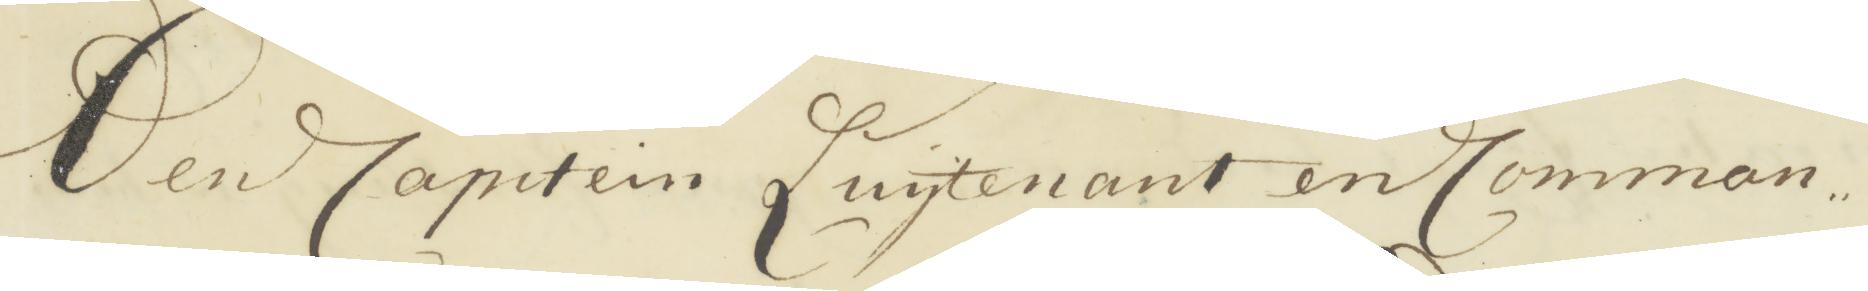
Den Capitein Luijtenant en Comman„
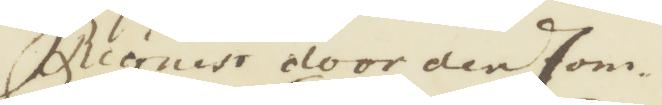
Request door den Com„
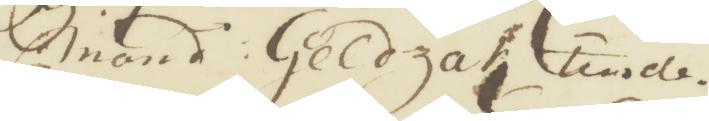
mand:t Geldzak ten de.
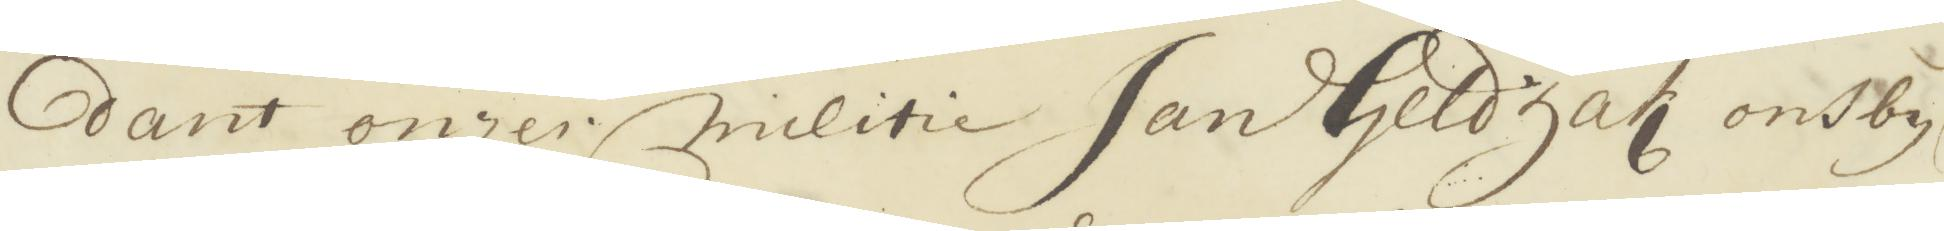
dant onzer militie Jan Geldzak ons by
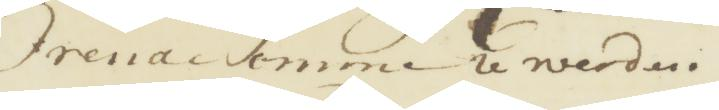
rende somme te werden
